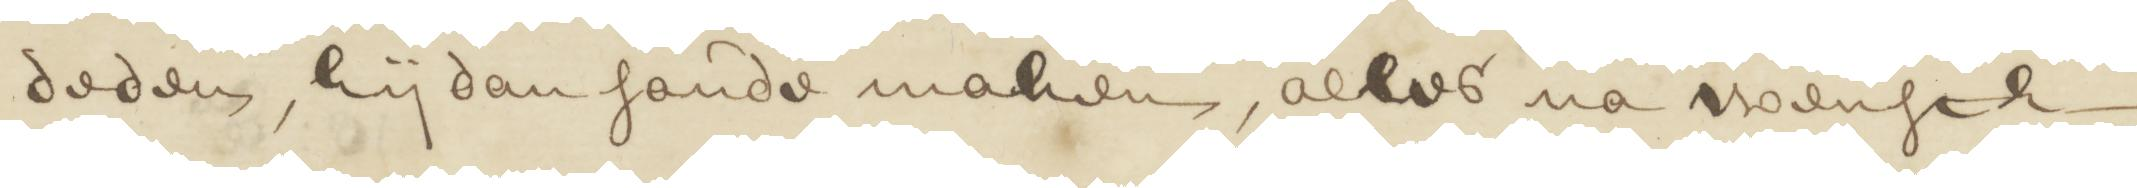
deden, hij dan soude maken, alles na wensch
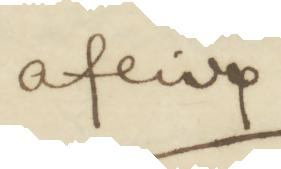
afliep
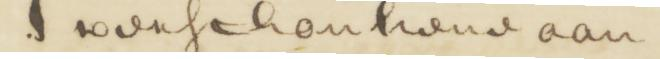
’t verschonkene aan
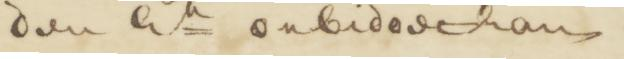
den h=r orbidoechan
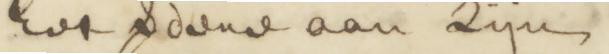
het verdere aan zijn
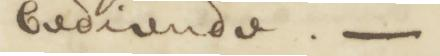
bediende.—
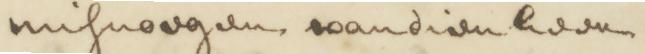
misnoegen van dien heer
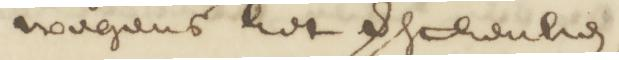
wegens het verschenken
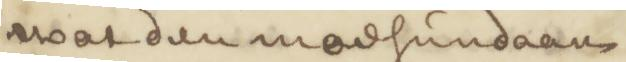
wat den moesundaan
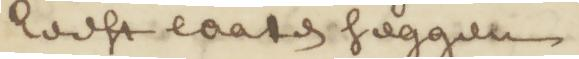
heeft laaten seggen
